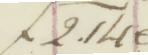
ƒ 2.14
